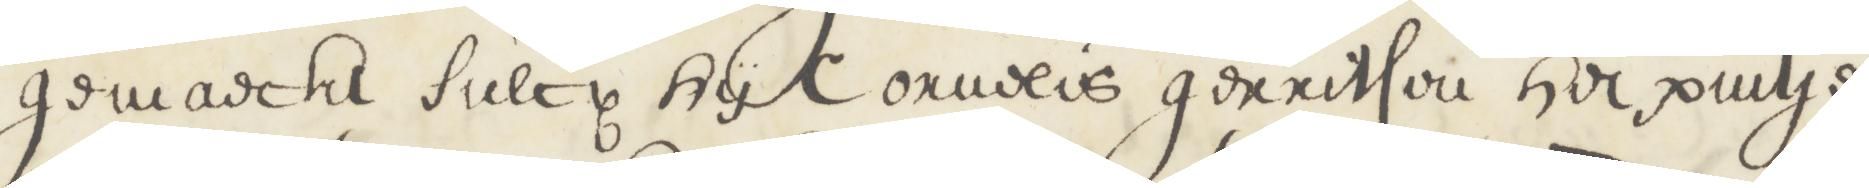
gemaeckt sulcx hij Cornelis gerritsen het pintje
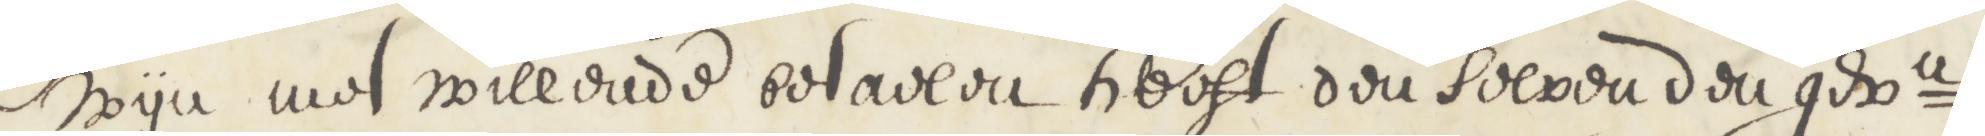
wijn niet willende betaelen heeft den selven den gev=n
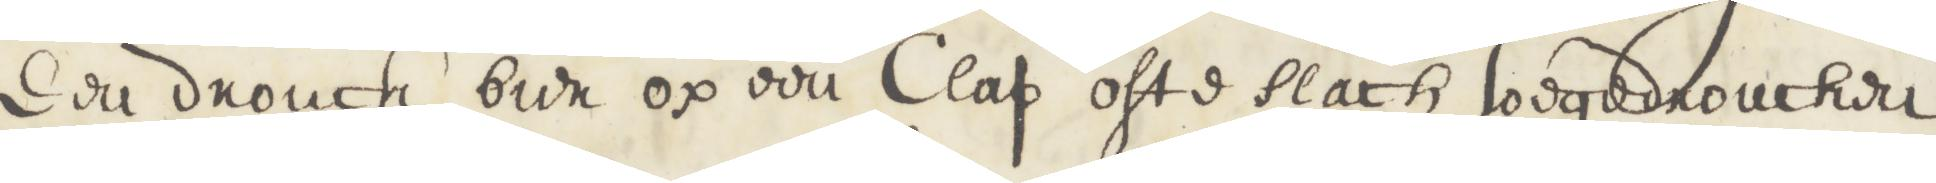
Een dronck bier op een Clap ofte slach toegedroncken
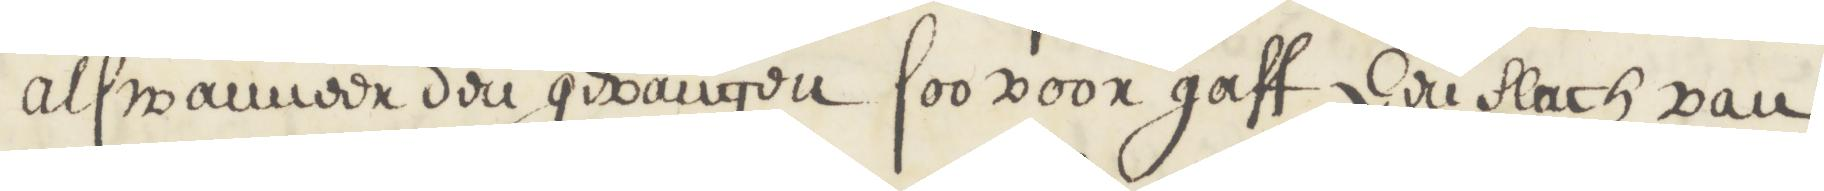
als wanneer den gevangen soo voor gaff Een slach van
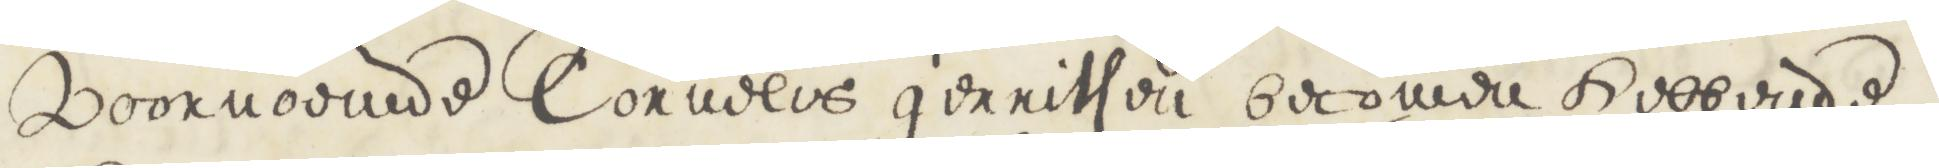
voornoemde Cornelis gerritsen becomen hebbende
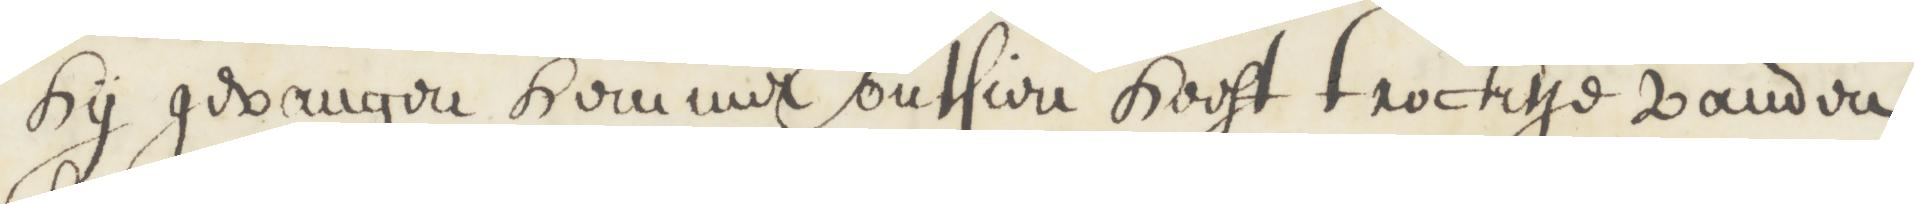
hij gevangen hem niet ontsien heeft t rocktje vanden
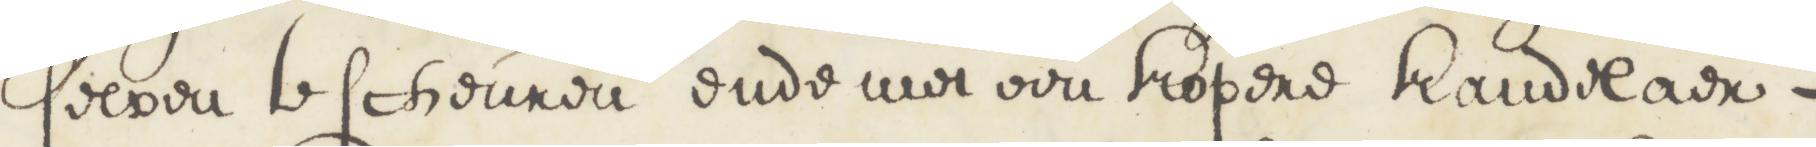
selven te scheuren ende met een kopere kandelaer
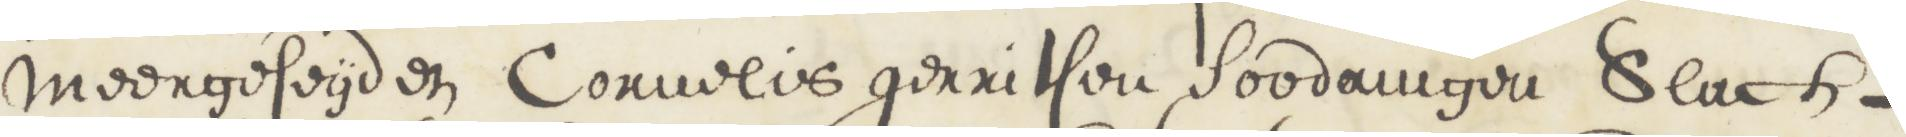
meergeseijden Cornelis gerritsen soodanigen Slach -
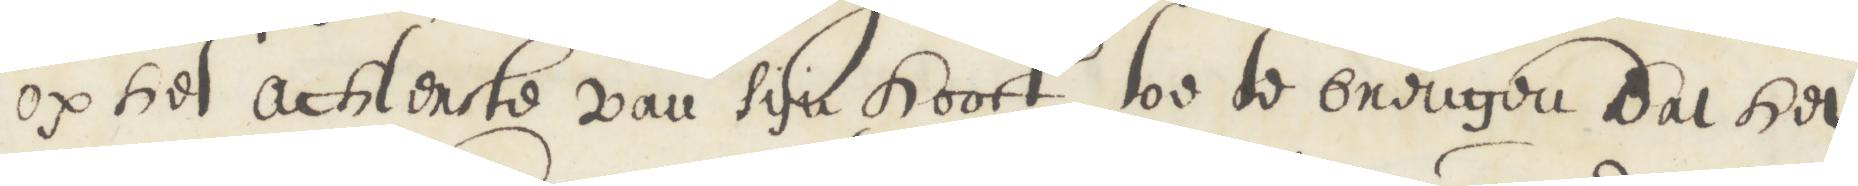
op het achterste van sijn hooft toe te brengen dat het
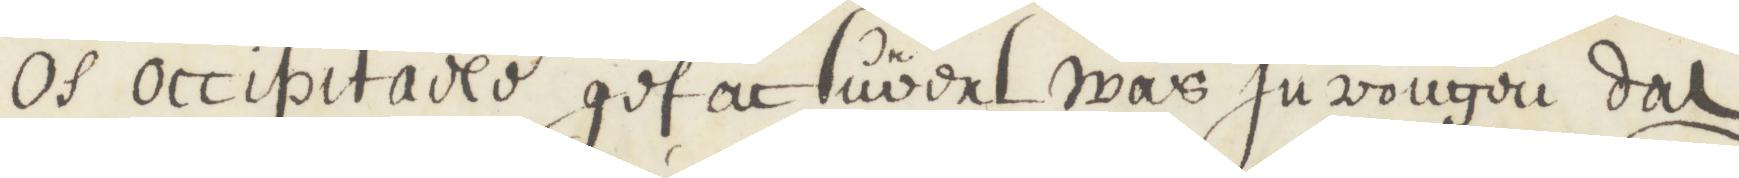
Os occipitaele gefactueert war jn vougen dat
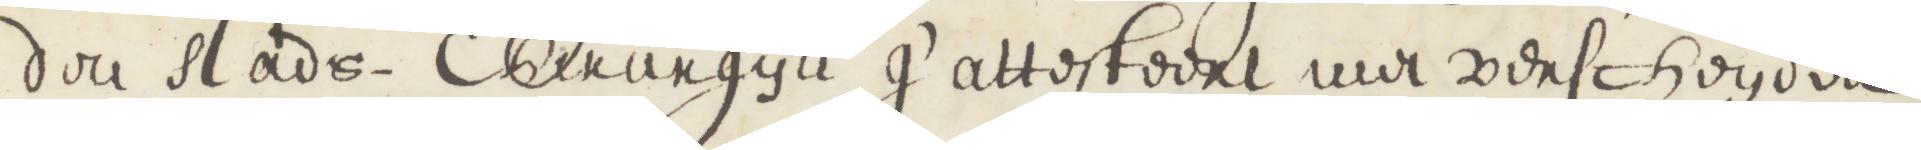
den stads-Chirurgijn g’attesteert met verscheijden
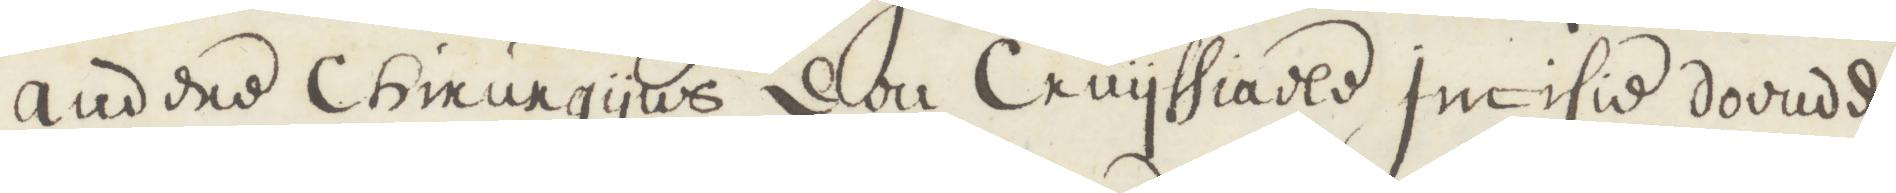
andere Chirurgijns Een Cruijssiaele Jncisie doende
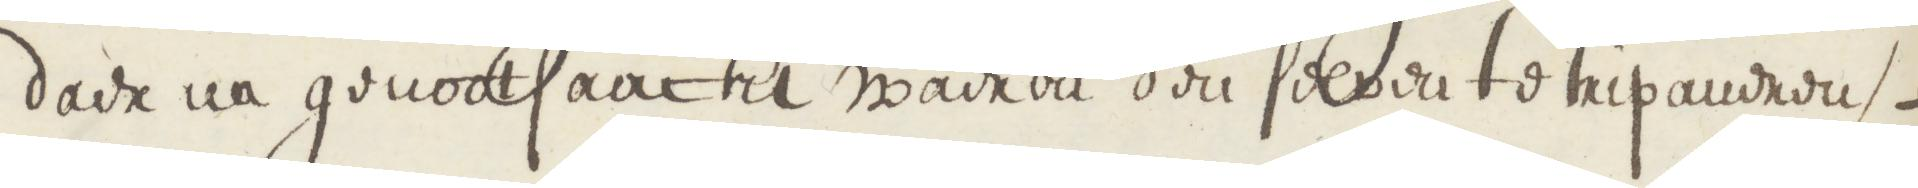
daer na genootsaackt waeren den selven te tripaneren/
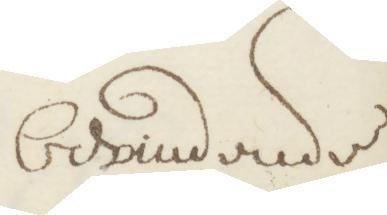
bevindende
